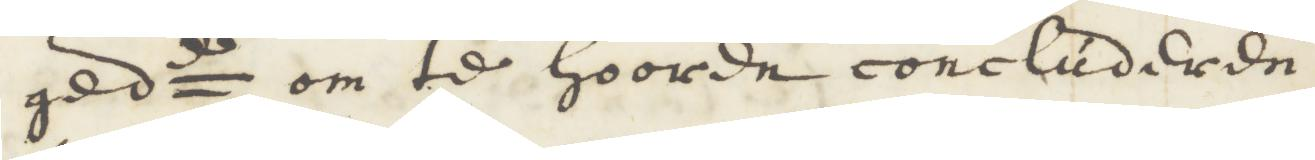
ged=de om te hooren concluderen
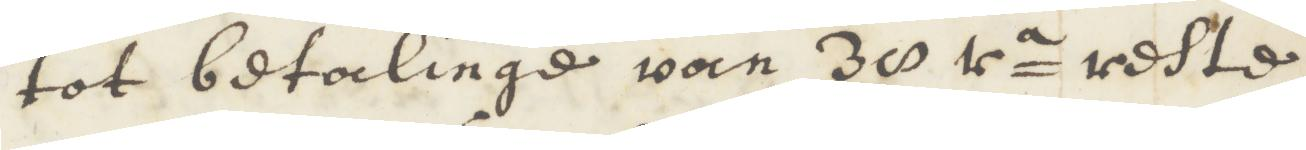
tot betalinge van 38 r=a reste
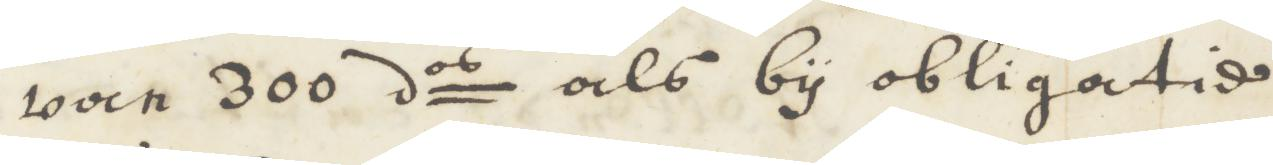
van 300 d=os als bij obligatie
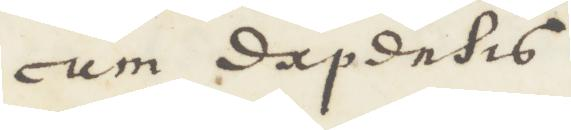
cum Expensis —
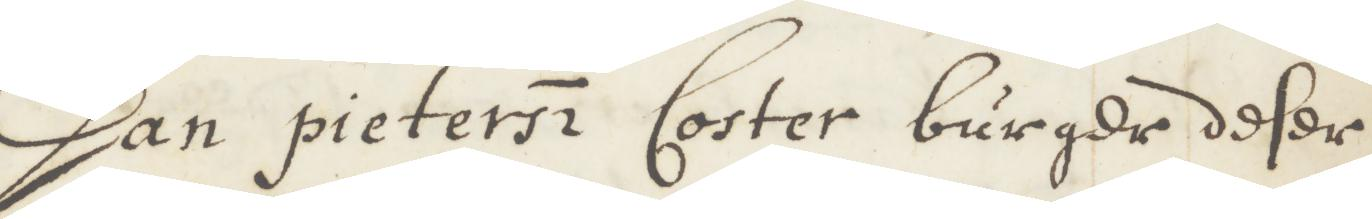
Jan pietersz Coster burger deser
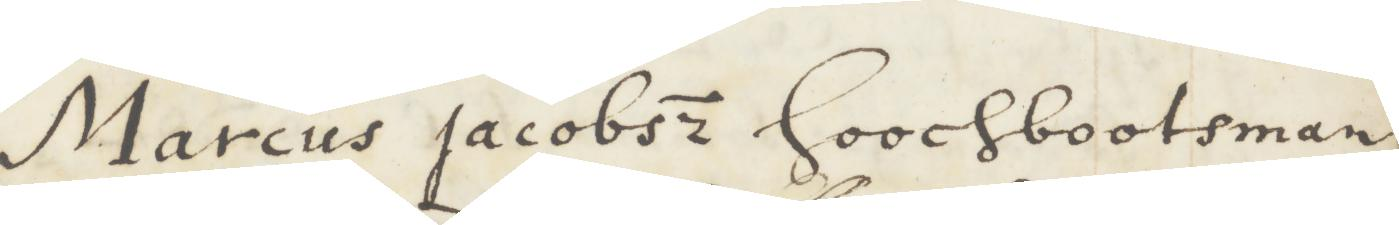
Marcus jacobsz Hoochbootsman
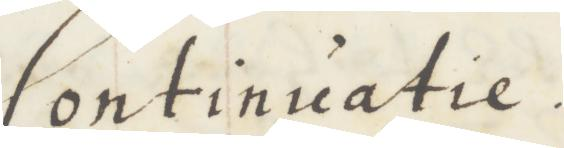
Continuatie.
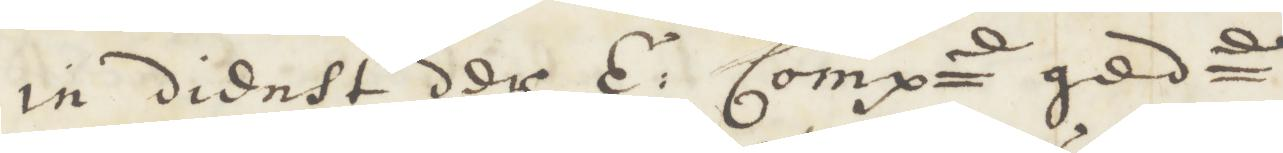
in dienst der E: Comp=e ged=e
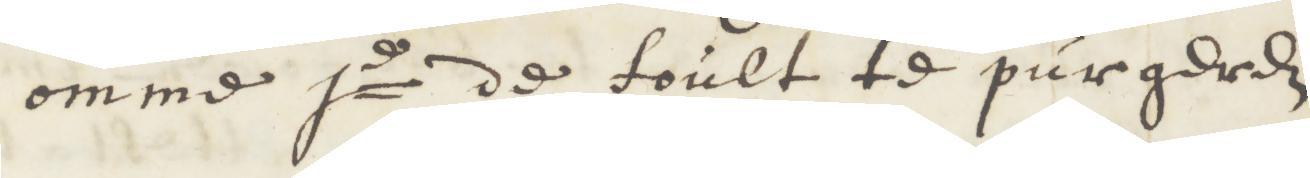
omme j=e de foult te purgeren
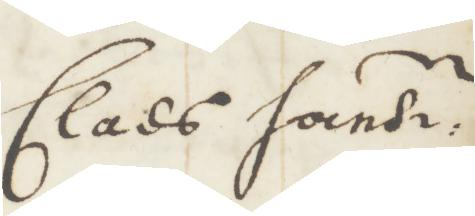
Claes sandr:
